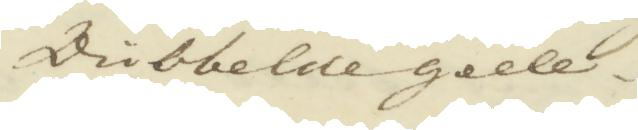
Dubbelde geele
